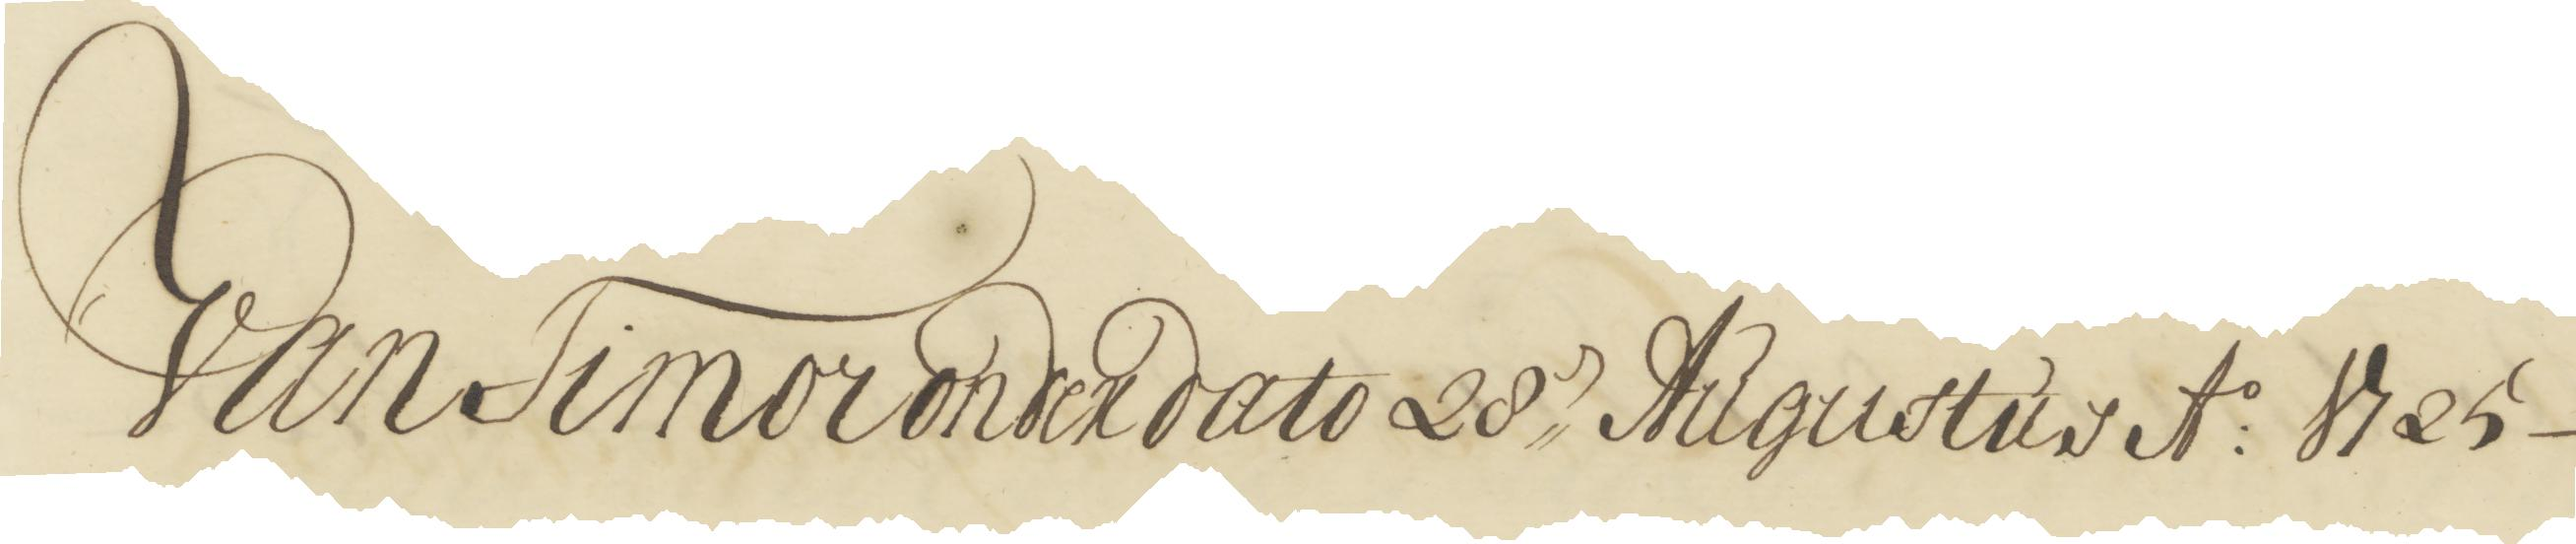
Van Timor onder dato 28„en Augustus A:o 1725-
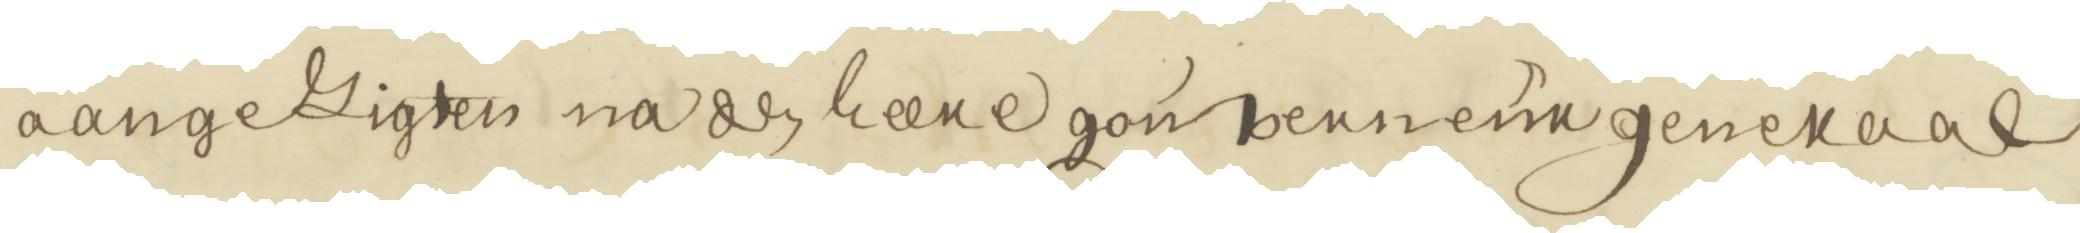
aangezigten na den heere gouverneur generaal
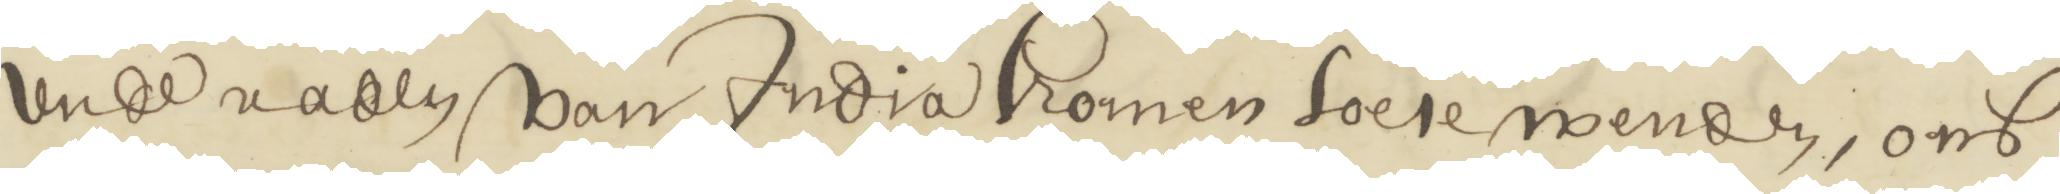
en de raden van Jndia komen toe te wenden, ons
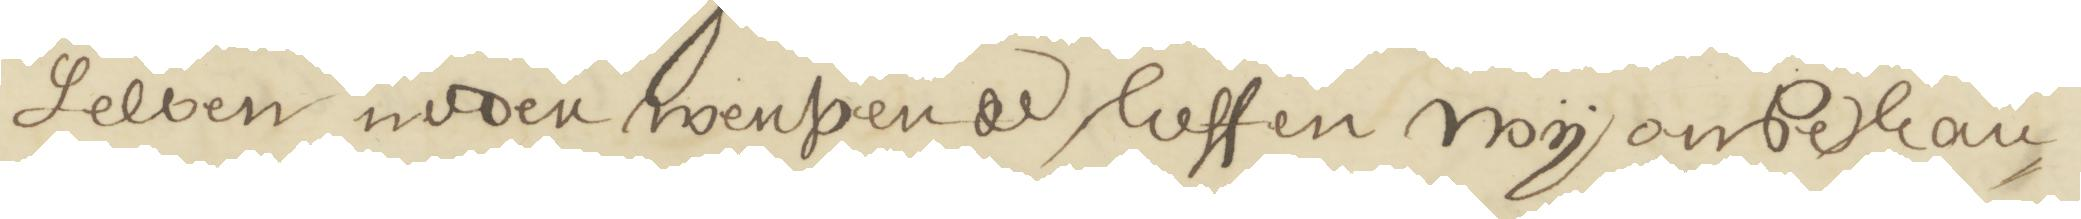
selven neder werpende heffen wij onse han„
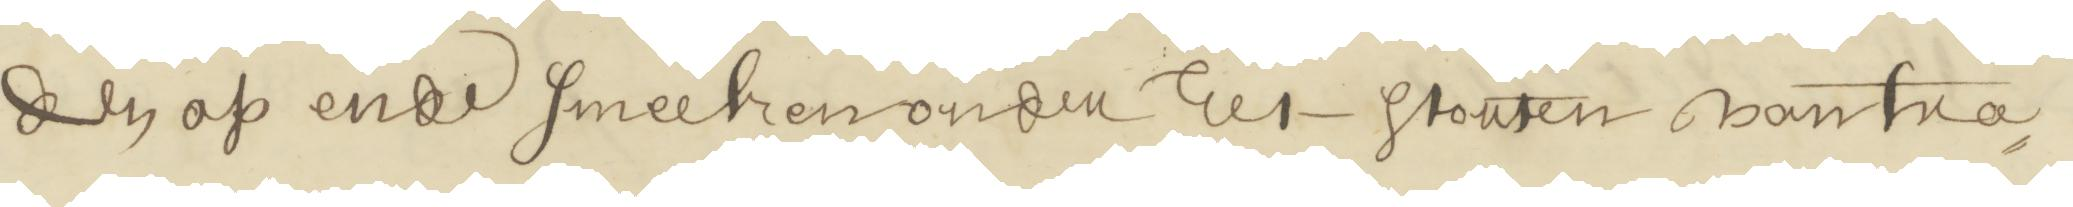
den op ende smeeken onder het storten van tra„
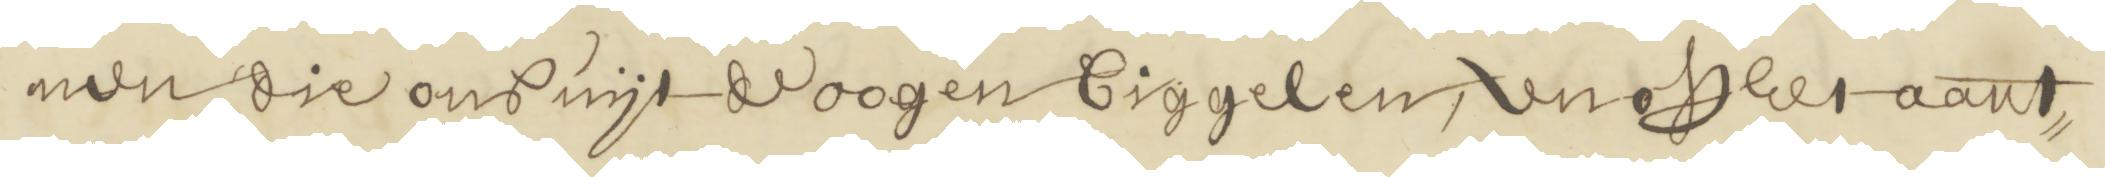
nen die ons uijt de oogen biggelen, en op het aart„
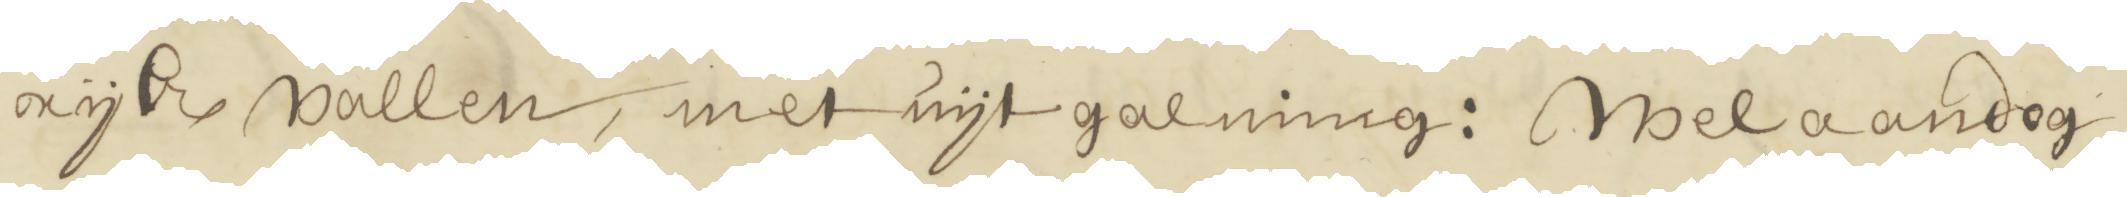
rijk vallen, met uijt galming: wel aandog
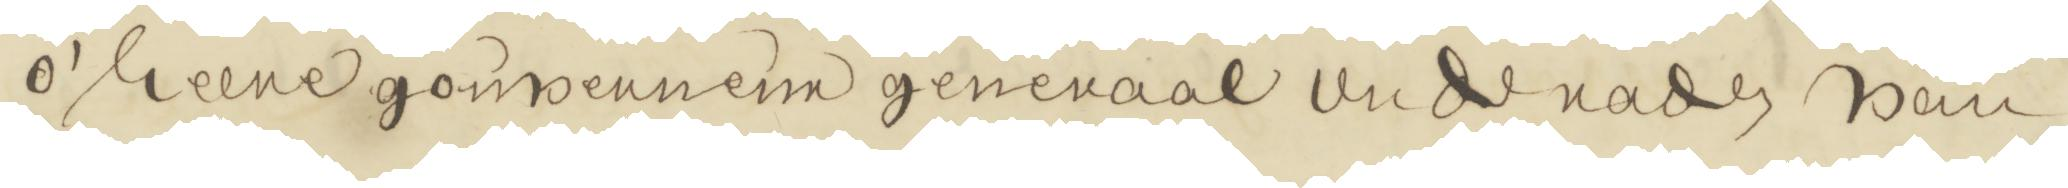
o’ heere gouverneur generaal en de raden van
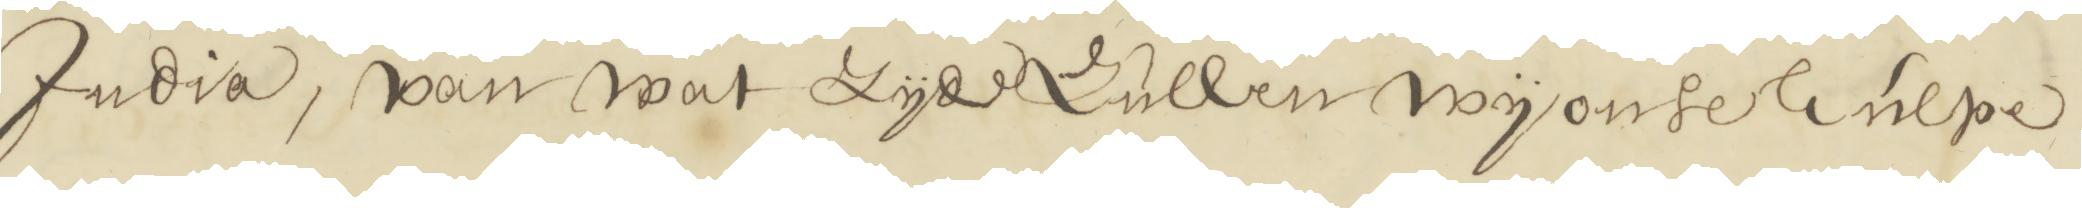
Jndia, van wat zijde zullen wij onse hulpe
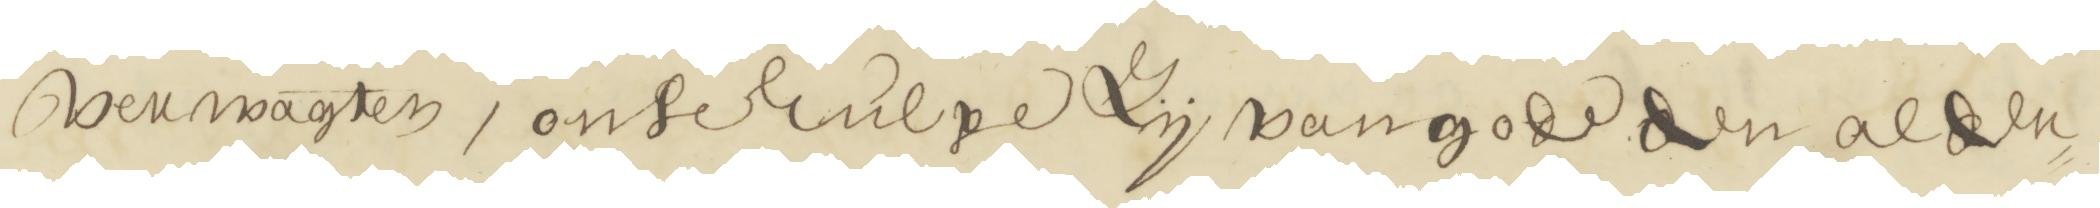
verwagten, onse hulpe zij van gode den alder„
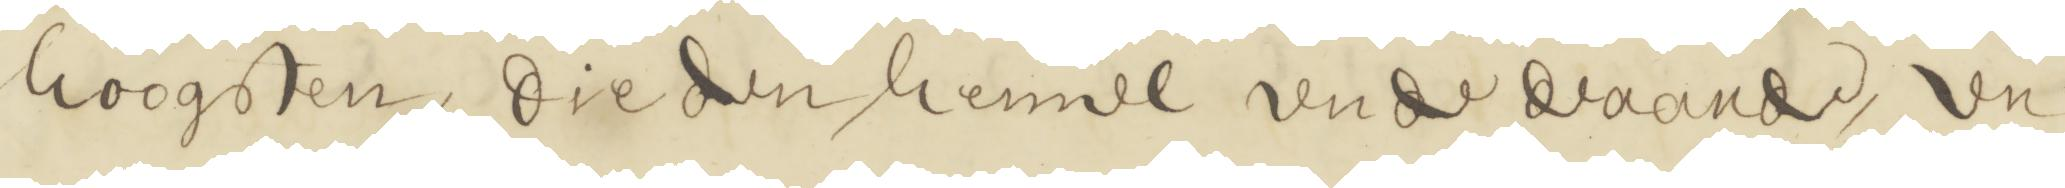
hoogsten, die den hemel ende de aarde, en
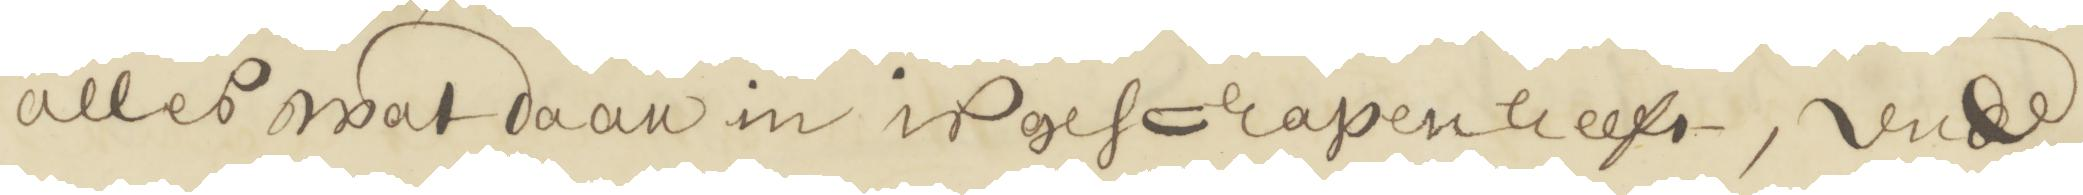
alles wat daar in is geschapen heeft, en de
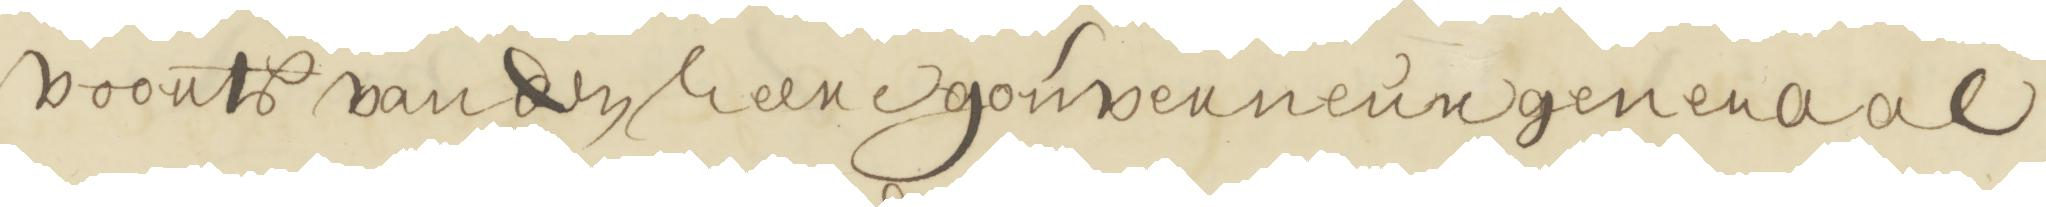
voorts van den heere gouverneur generaal
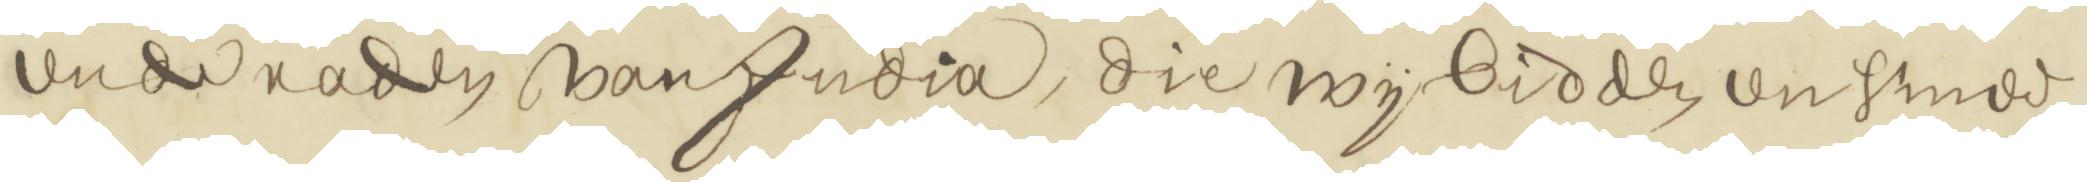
ende raden van Jndia, die wij bidden en smee
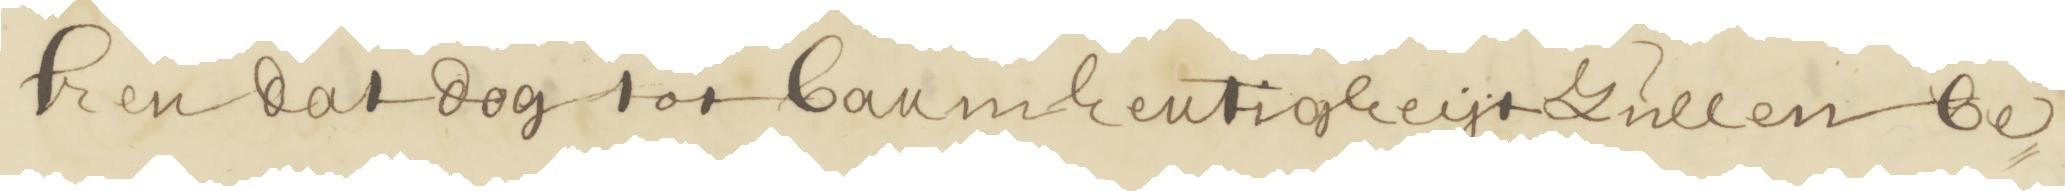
ken dat dog tot barmhertigheijt zullen be„
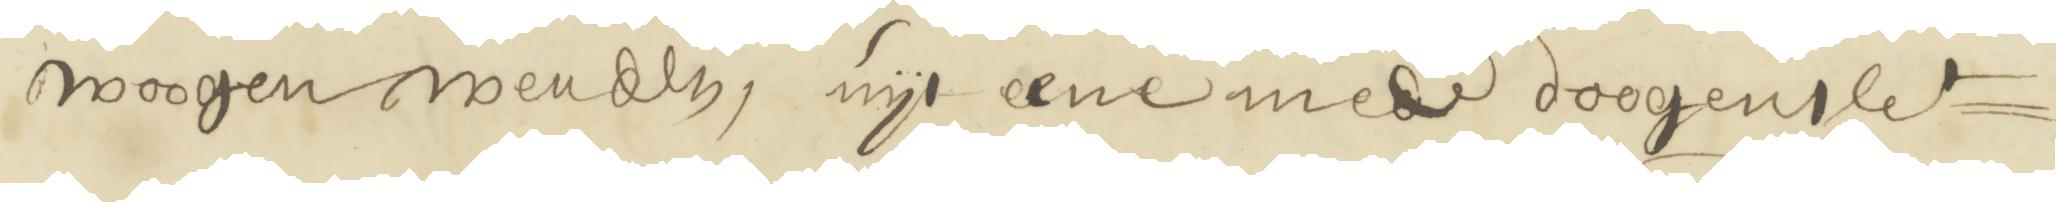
woogen werden, uijt eene mede doogenth=t
